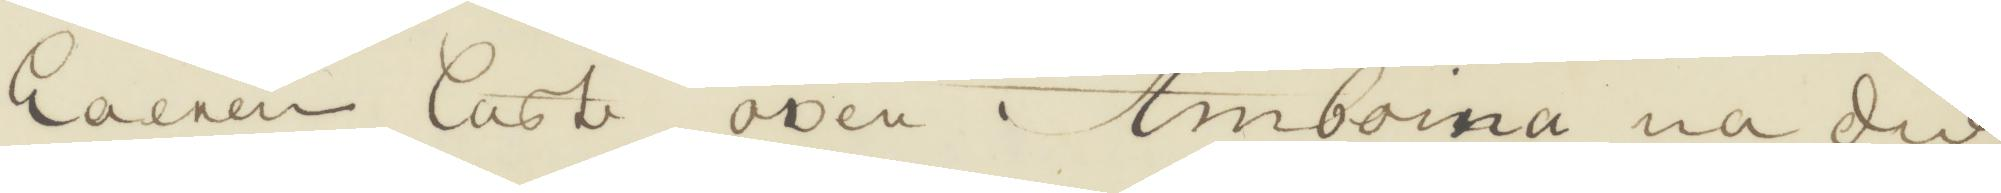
haeren laste over Amboina na die
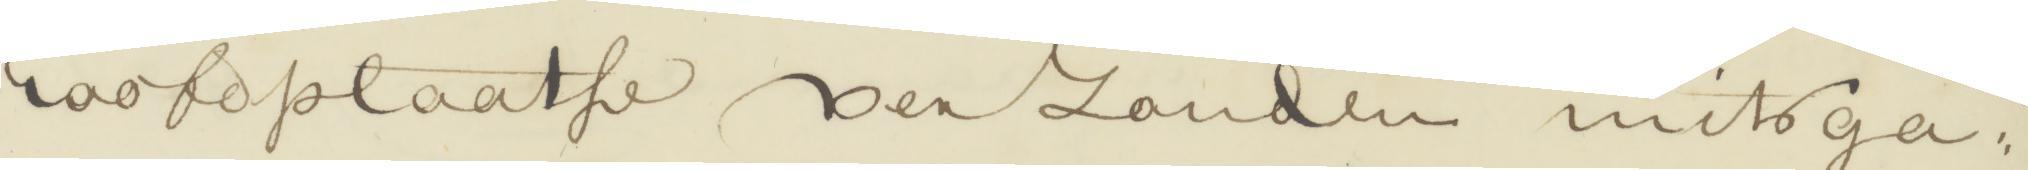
hoofdplaatse verzonden mitsga„
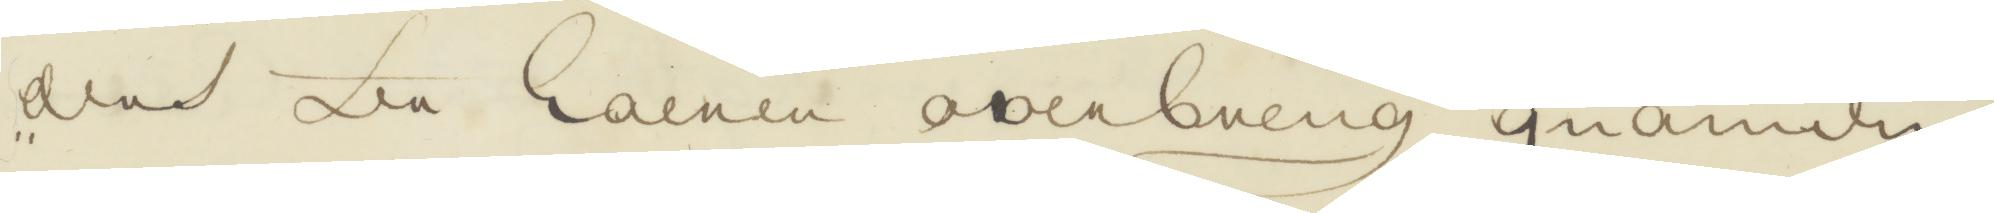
„ders ter haeren overbreng quamen
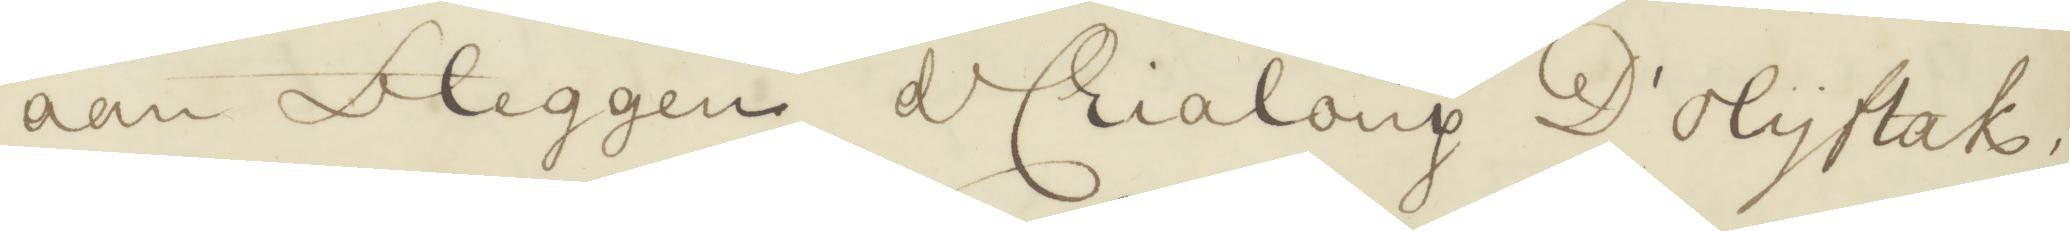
aan teleggen deChialoup D'olijftak,
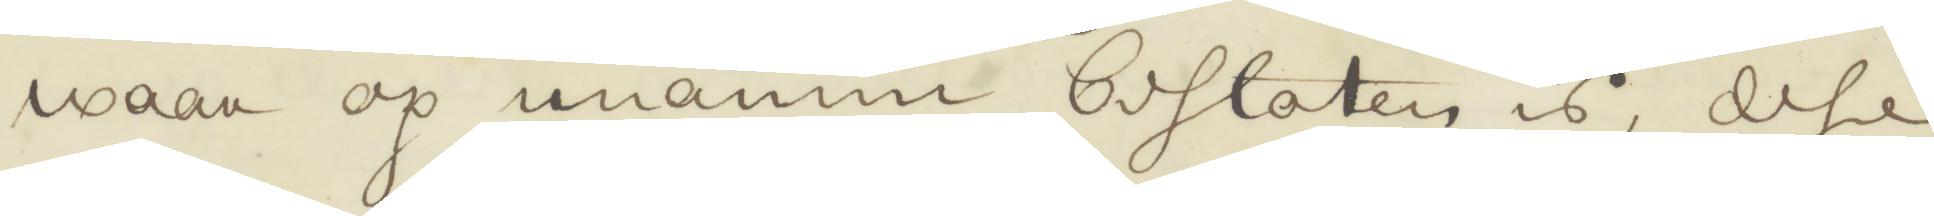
waar op unanim besloten is, dese
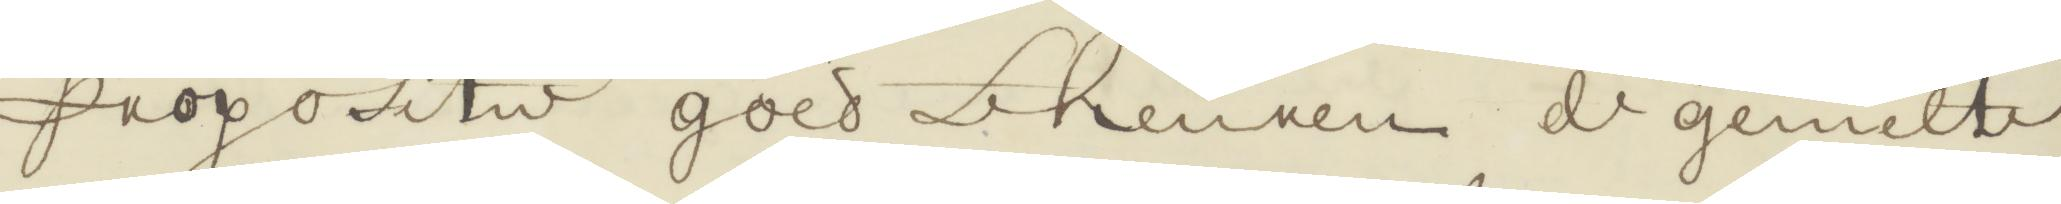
propositie goed tekeuren de gemelte
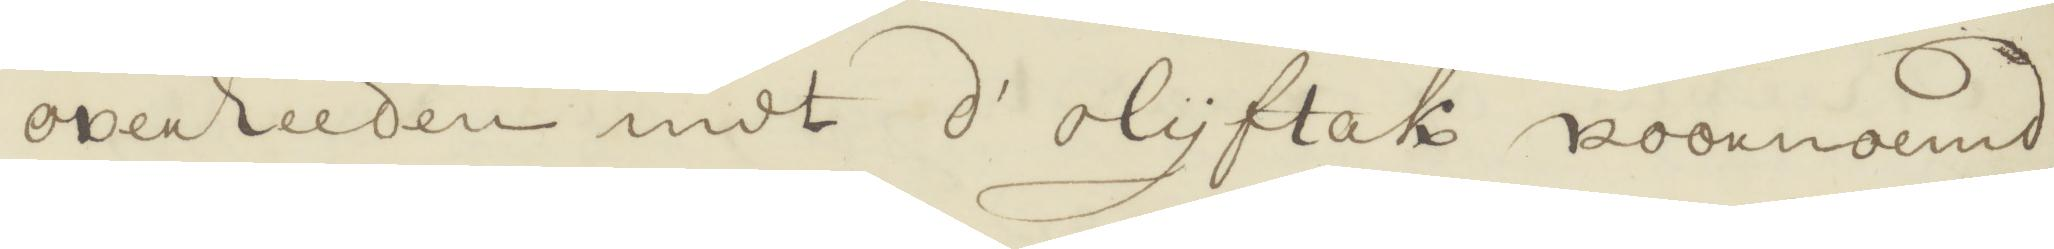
overheeden met d’ olijftak voornoemd
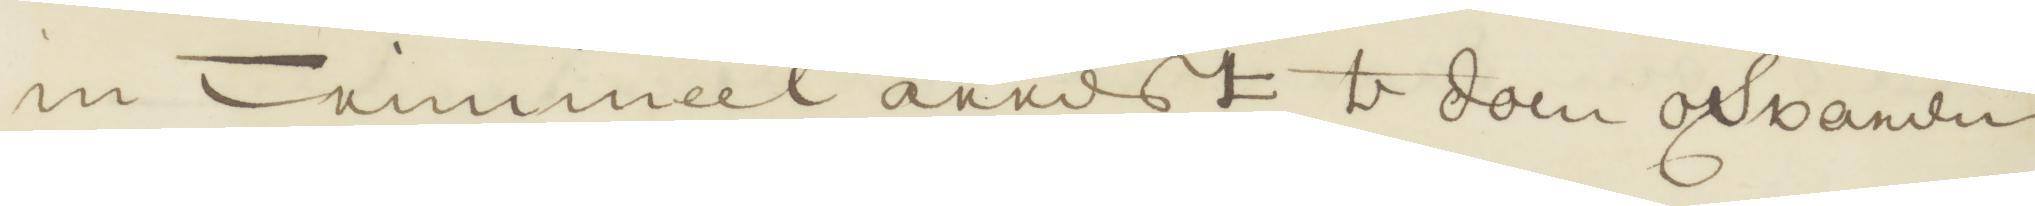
in Crimimeel arrest te doen overvaren
